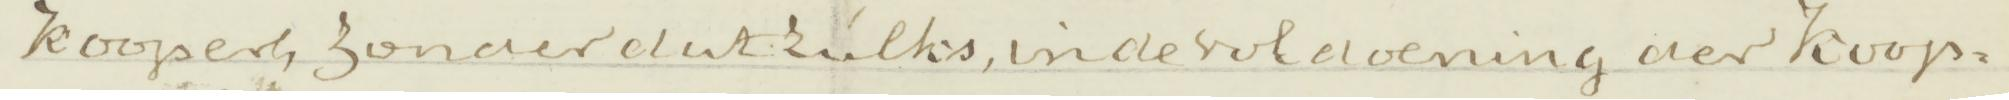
koopers zonder dat zulks, in de voldoening der Koop=
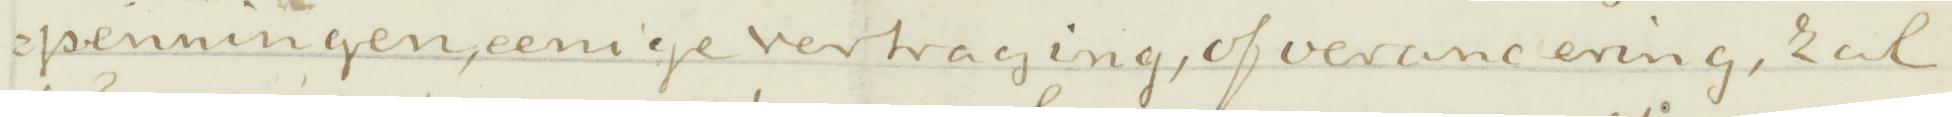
=penningen, eenige vertraging, of verandering, zal
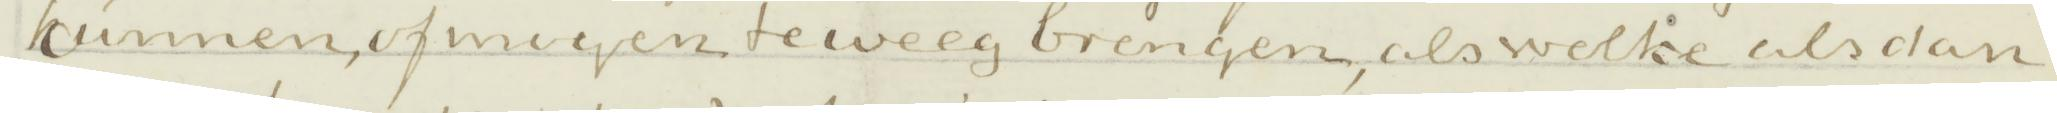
kunnen of mogen te weeg brengen, als welke als dan
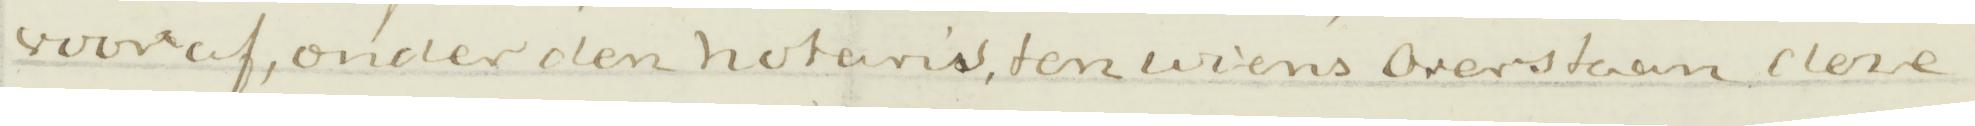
vooraf, onder den notaris, ten wiens overstaan deze
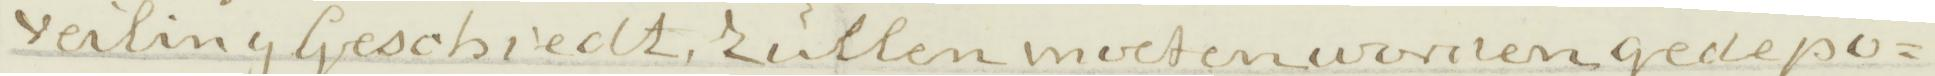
Veiling Geschiedt, zullen moeten worden gedepo=
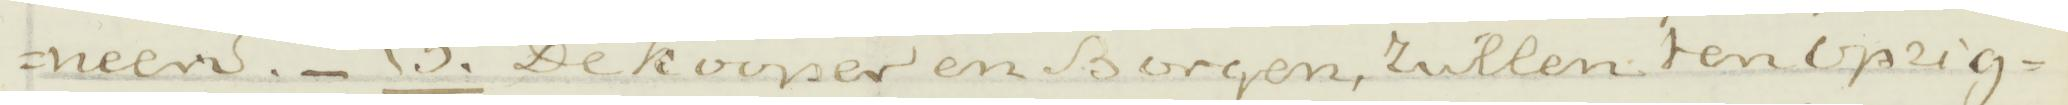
=neerd. — 15. De Kooper en Borgen, zullen ten opzig=
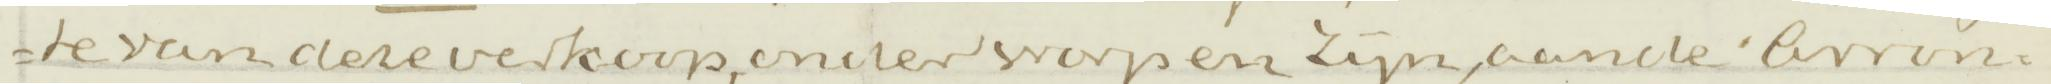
=te van deze verkoop onder worpen zijn, aande arron=
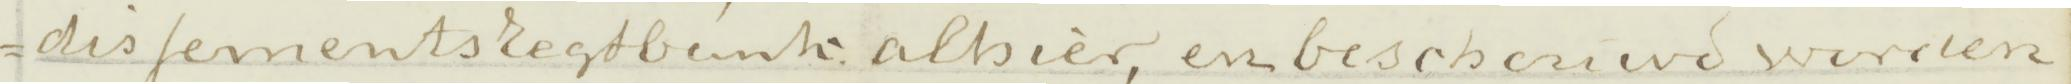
=dissements regtbank alhier, en beschouwd worden
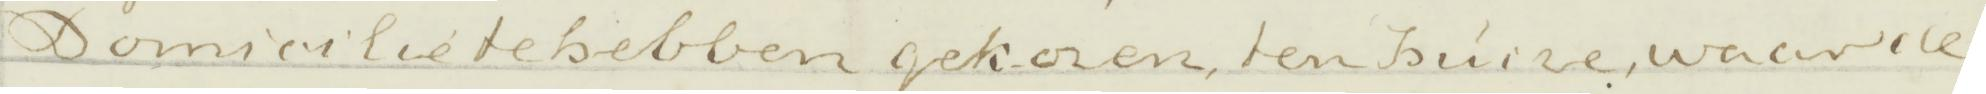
Domicilie te hebben gekozen, ten huize, waar de
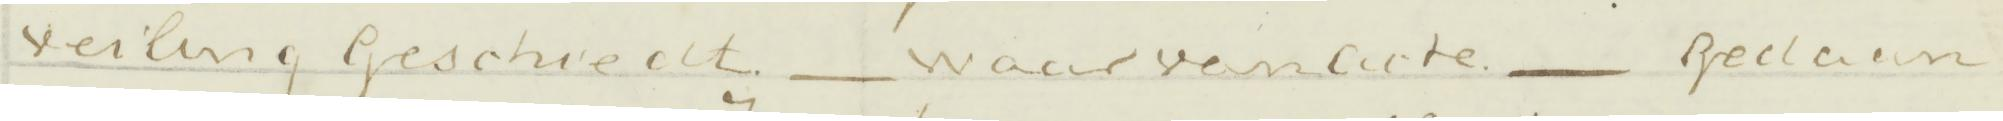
veiling geschiedt. — waarvan acte. — Gedaan
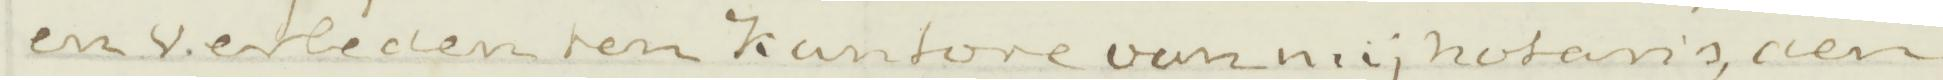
en verleden ten kantore van mij notaris, den
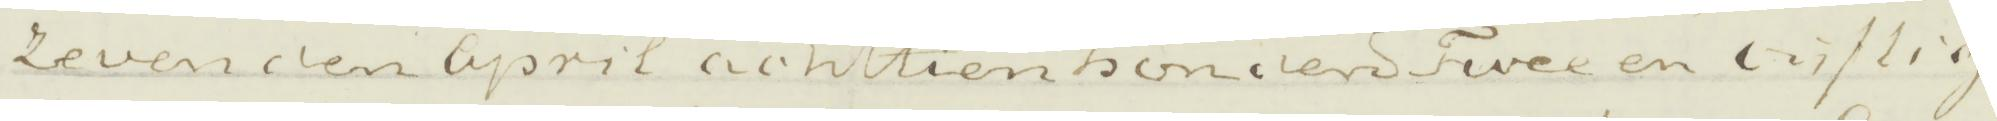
zeven den april achttienhonderd Twee en vijftig
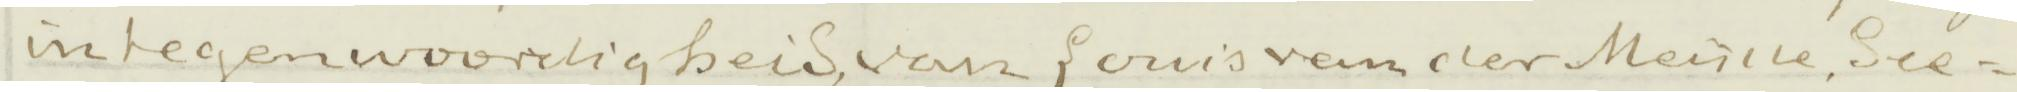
in tegenwoordigheid, van Louis van der Meijde, hee=
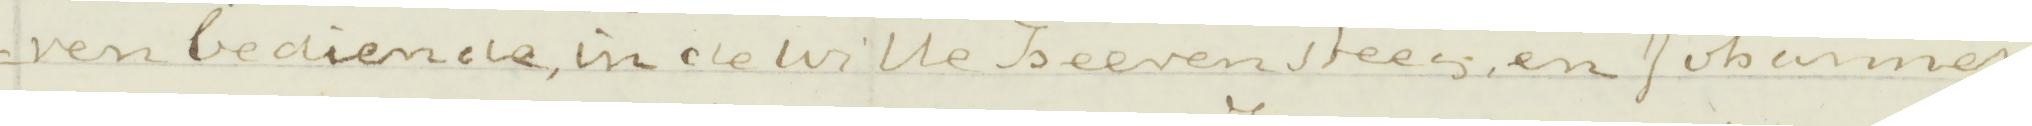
ren bediende, in de witte heerensteeg, en Johannes
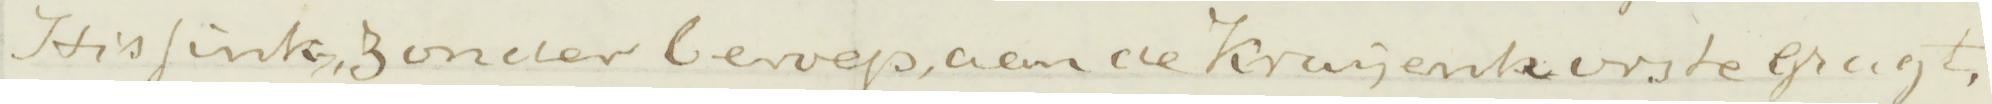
Hissink, zonder beroep, aan de Kraijenhorste Gragt,
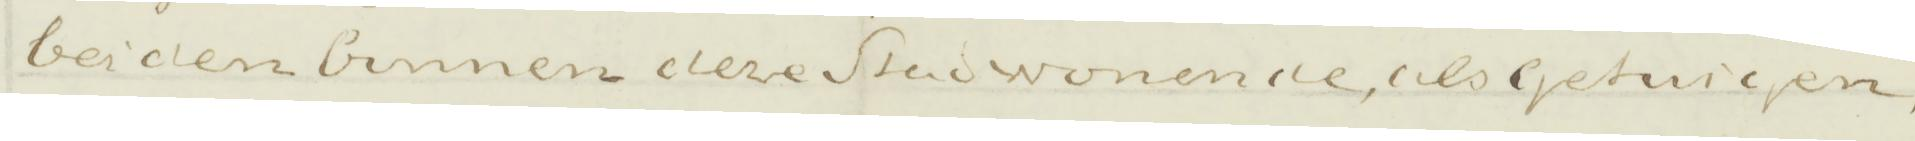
beiden binnen deze stad wonende, als getuigen
